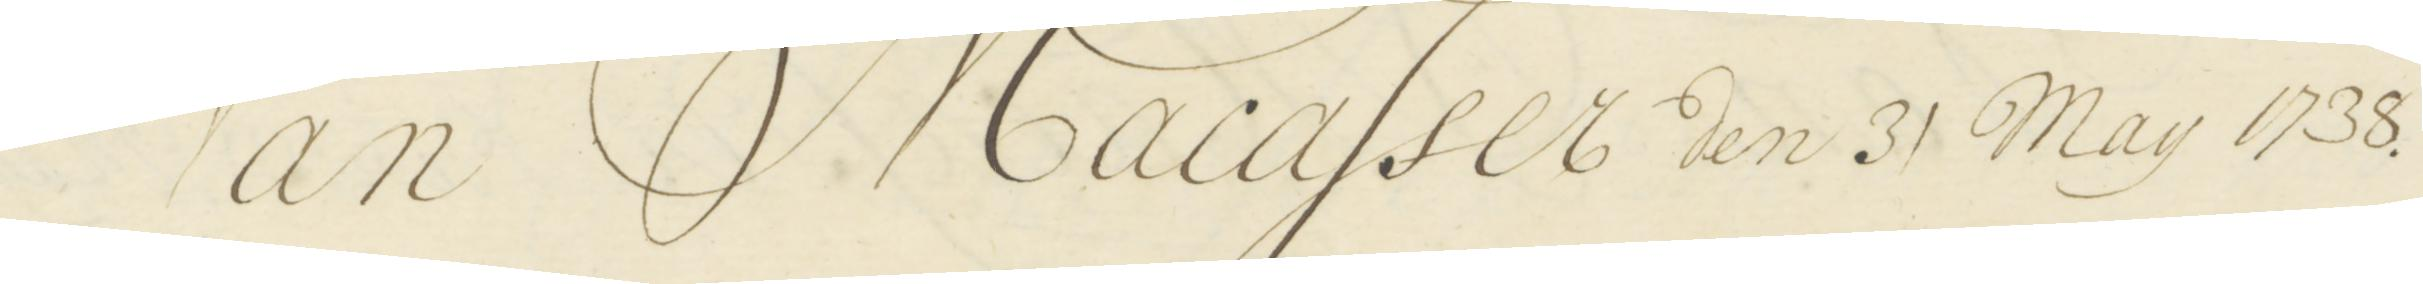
Van Macasser den 31 Maij 1738.
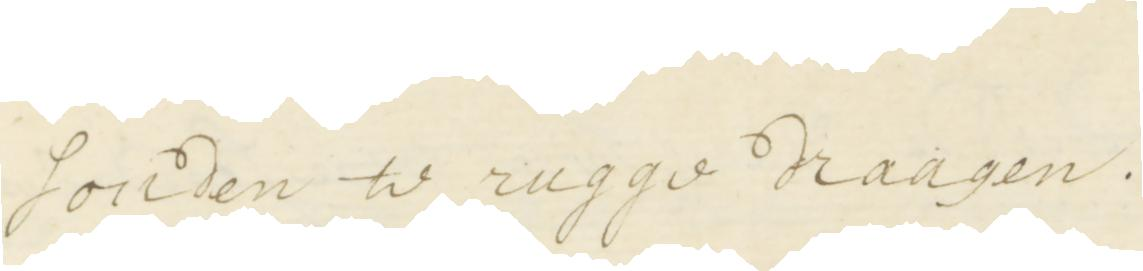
souden te rugge draagen.
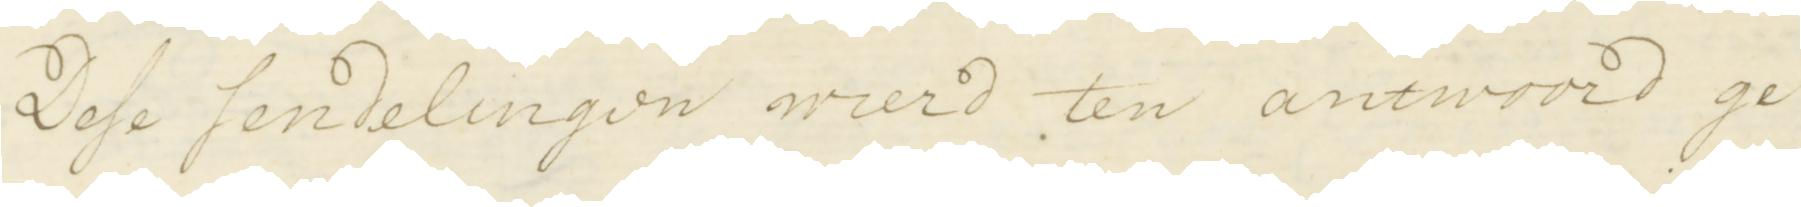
Dese sendelingen wierd ten antwoord ge
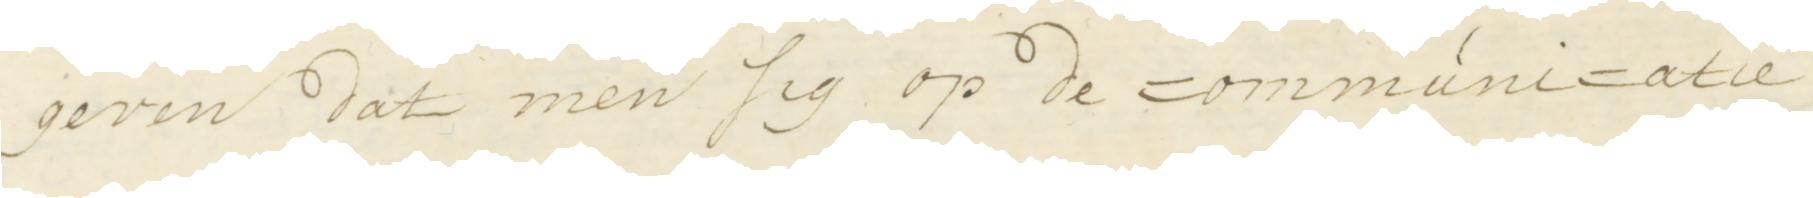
geven dat men sig op de communicatie
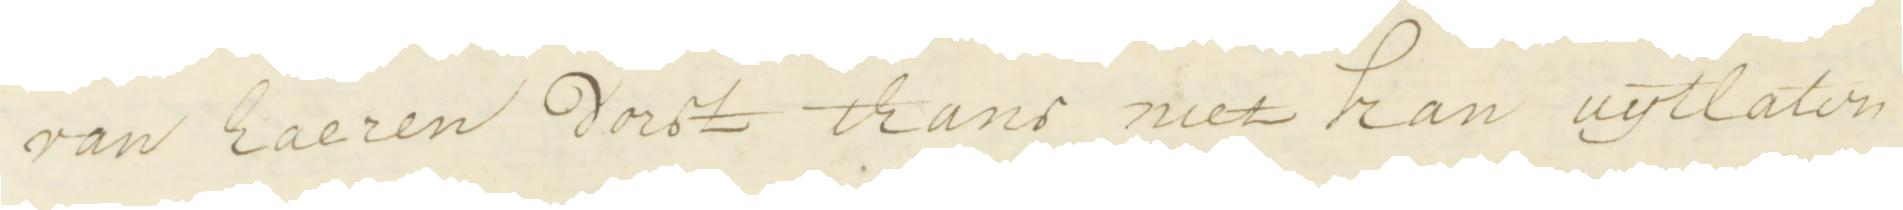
van haeren vorst thans niet kan uytlaten
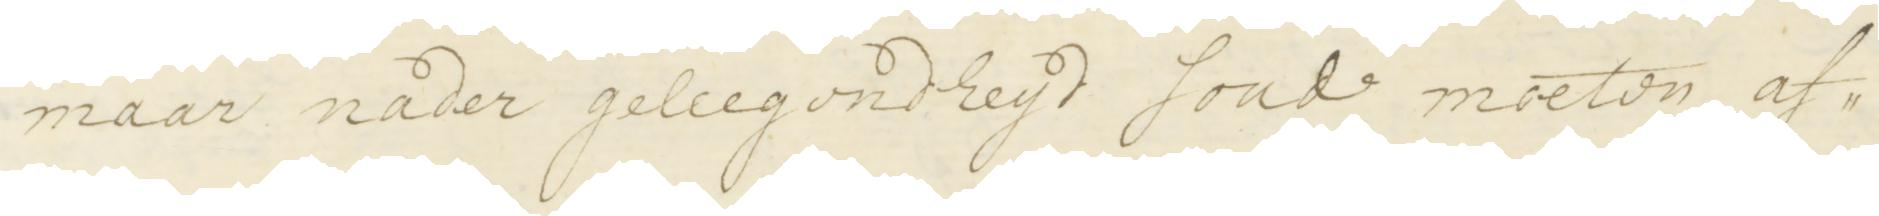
maar nader geleegendheyd soude moeten af„
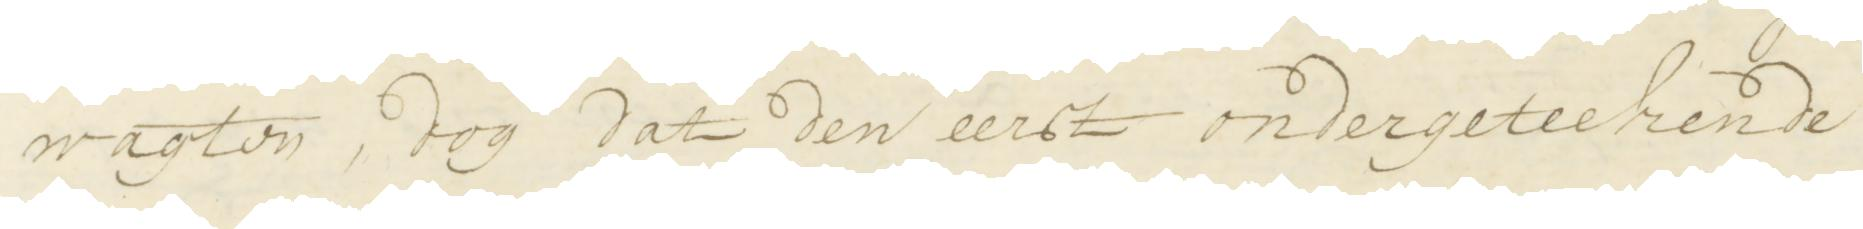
wagten, dog dat den eerst ondergeteekende
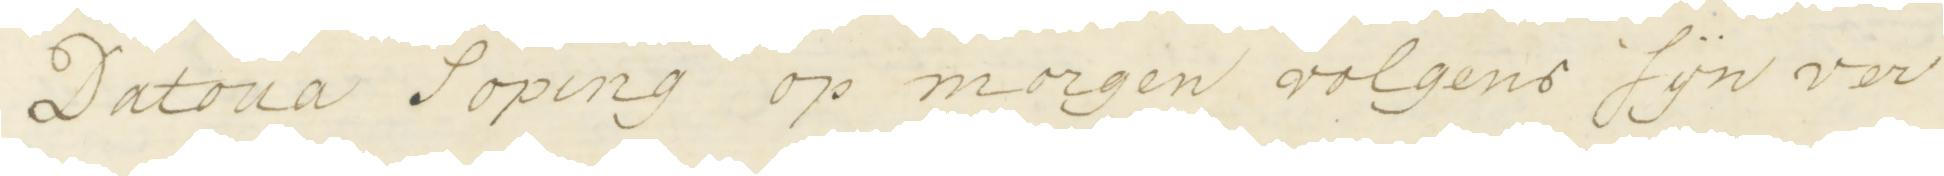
Datoua soping op morgen volgens sijn ver
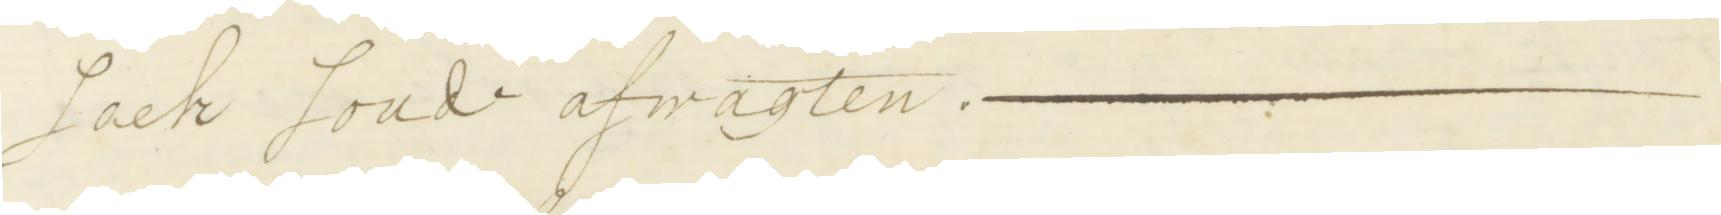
soek soude afwagten. —
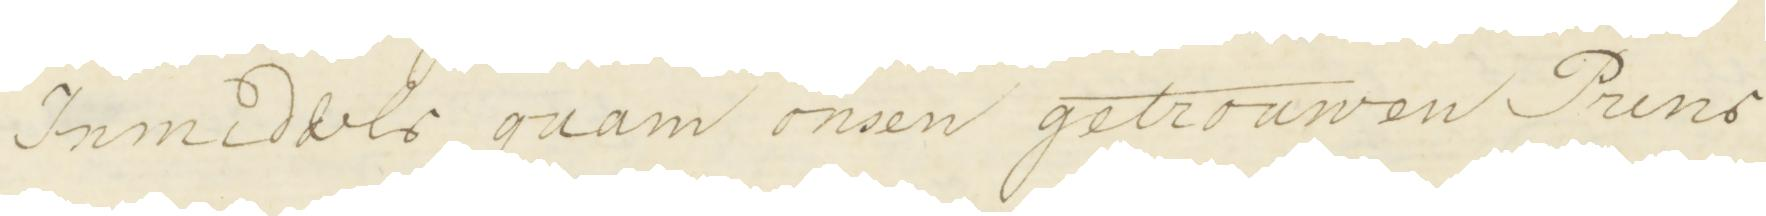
Inmiddels quam onsen getrouwen Prins
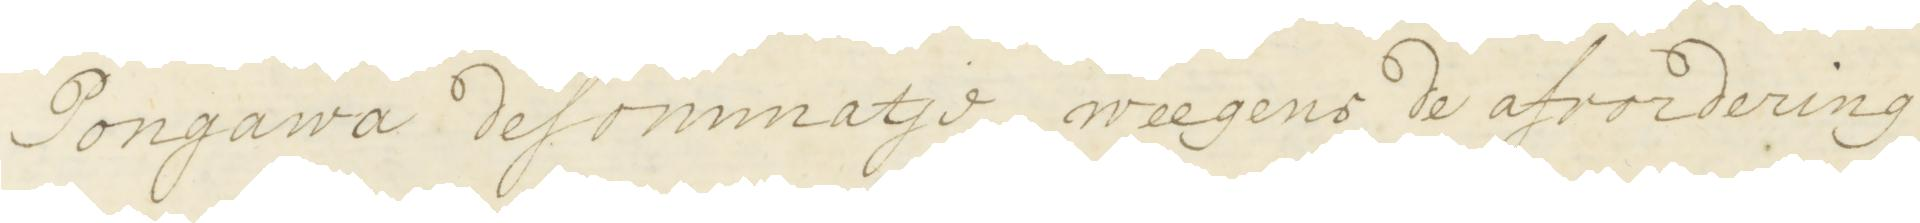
Pongawa desommatje weegens de afvordering
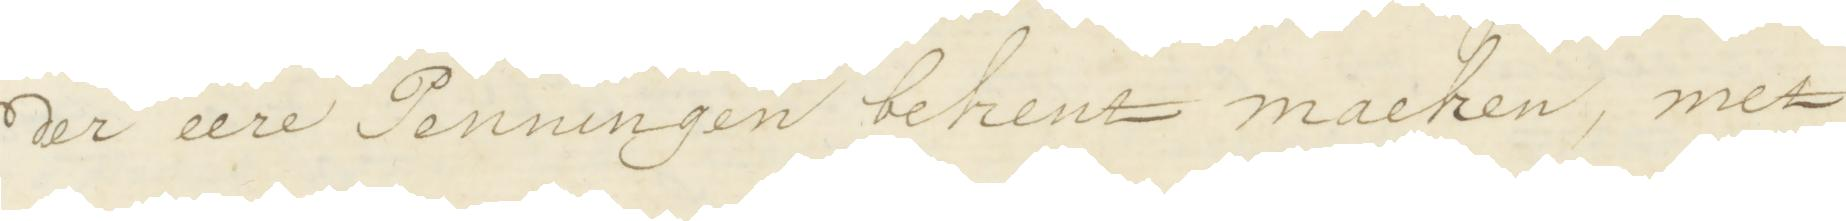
der eere Penningen bekent maeken, met
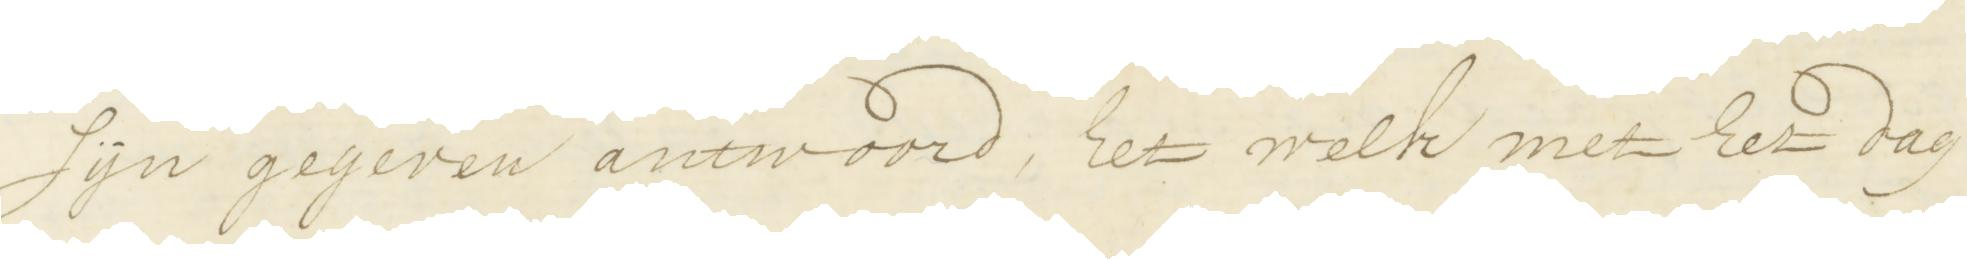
sijn gegeven antwoord, het welk met het dag
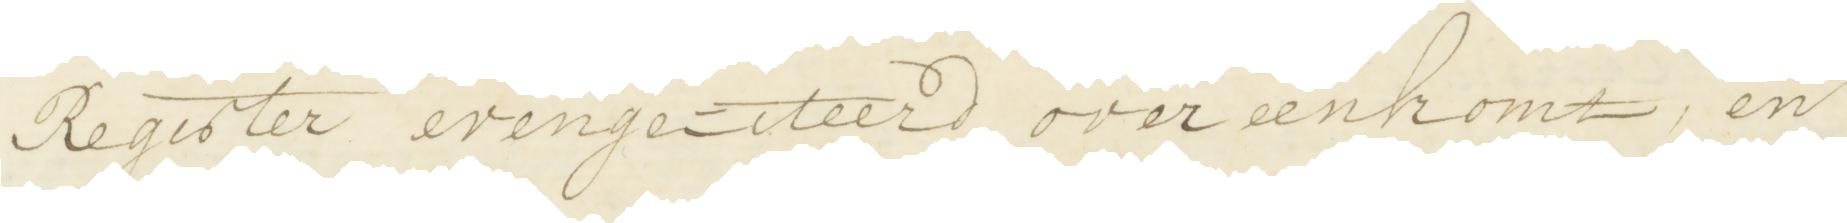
Register evengeciteerd over eenkomt, en
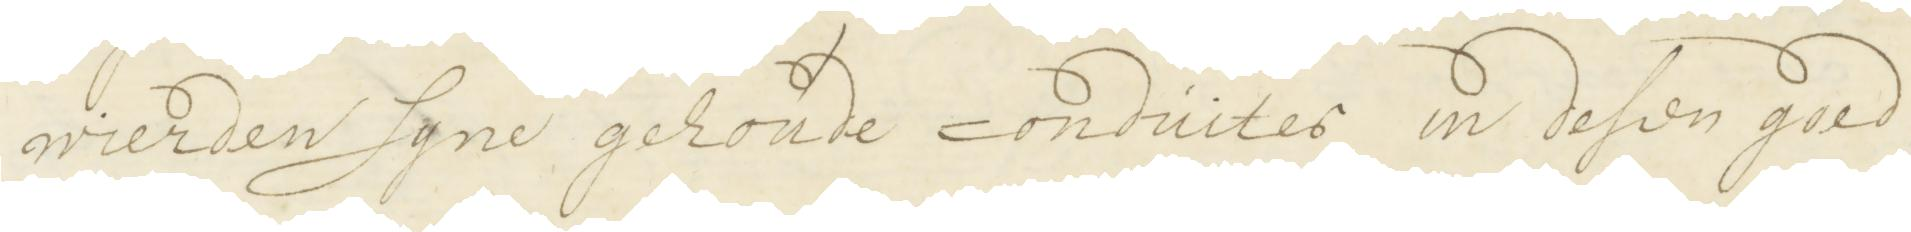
wierden syne gehoude conduites in desen goed
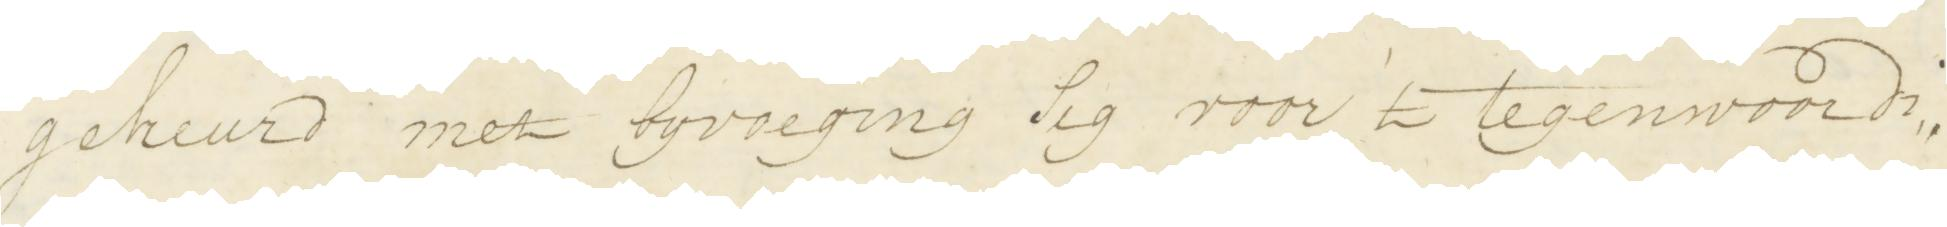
gekeurd met byvoeging sig voor ’t tegenwoordi„
